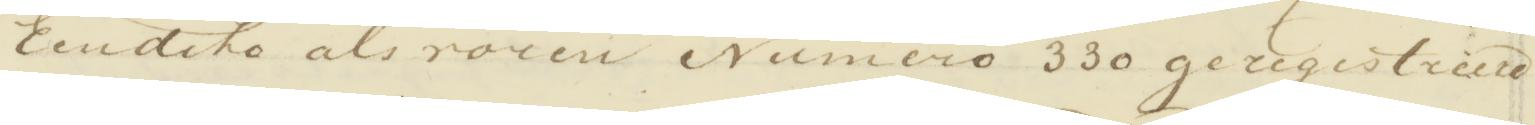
Een dito als voren Numero 330 geregistreerd
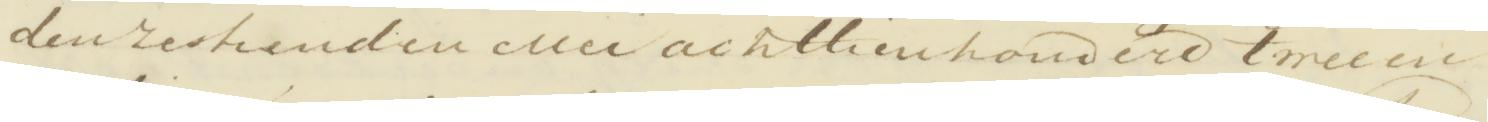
den zestienden Mei achttienhonderd twee en
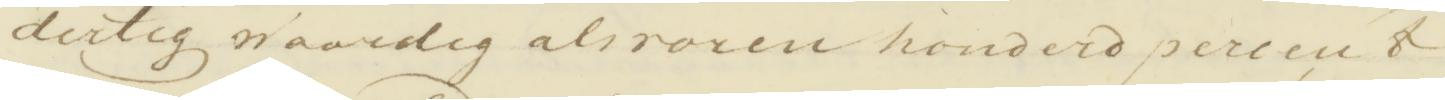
dertig waardig als voren honderd percent
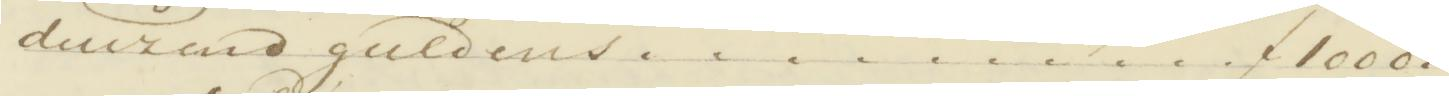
duizend guldens . . . . . . . . . . ƒ 1000.
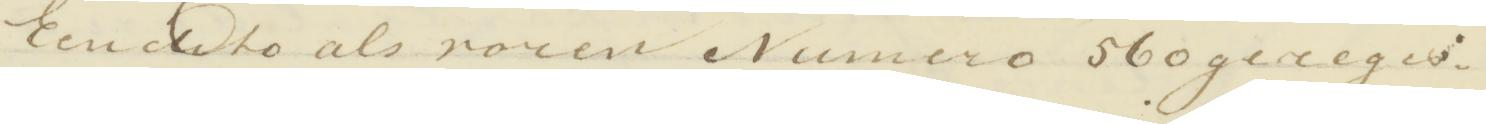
Een dito als voren Numero 560 geregis„
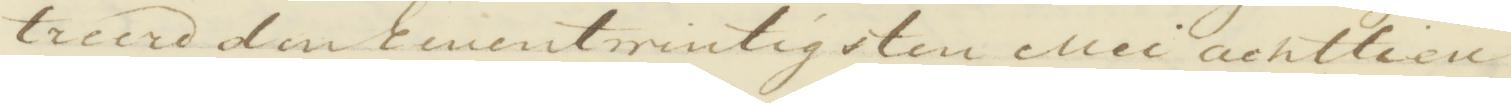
treerd den Eenentwintigsten Mei achttien
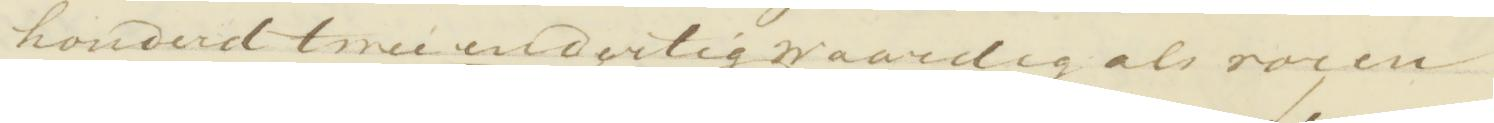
honderd twee endertig waardig als voren
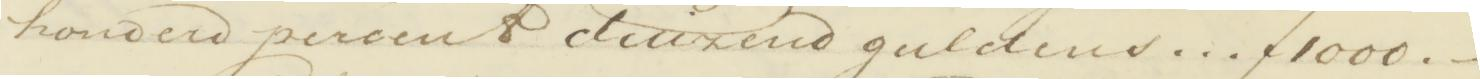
honderd percent duizend guldens . . . ƒ 1000. —
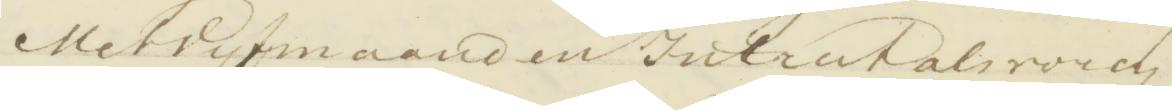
Met Vyf maand en Intrest als voren
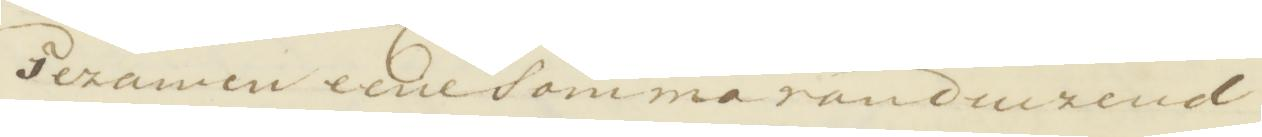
Tezamen eene somma van duizend
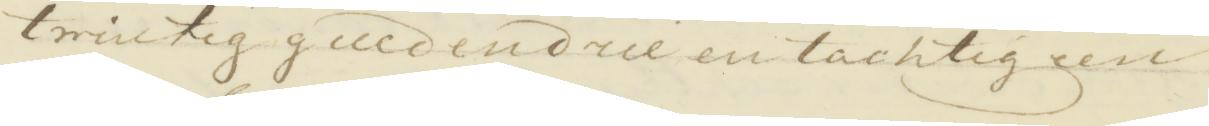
twintig gulden drie en tachtig een
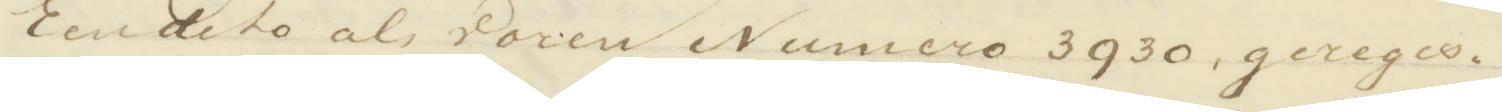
Een dito als voren Numero 3930, geregis„
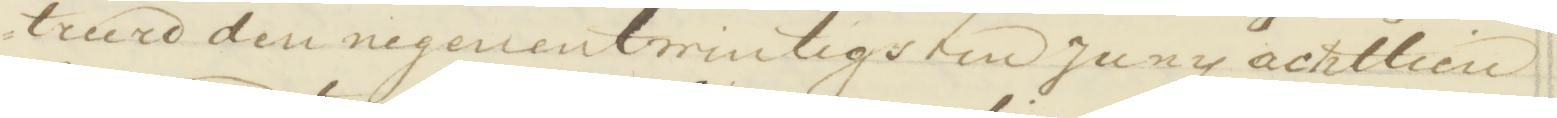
„treerd den negenentwintigsten Juny achttien
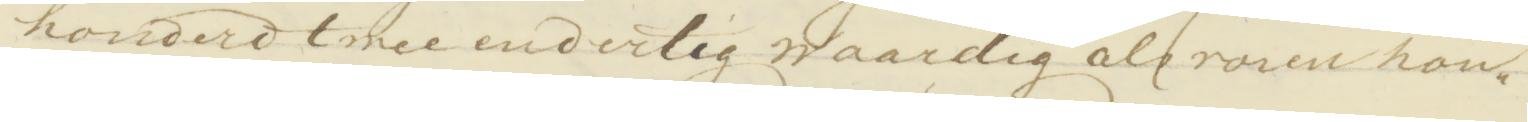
honderd twee endertig waardig als voren hon„
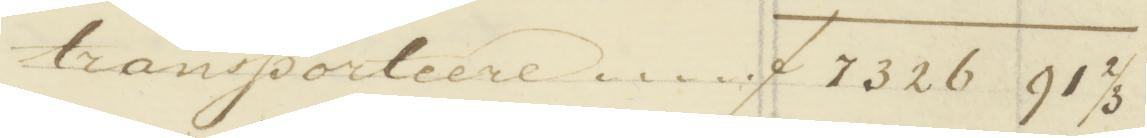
transporteere . . . . . ƒ 7326 91 2/3
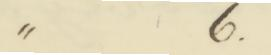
„ 6.
